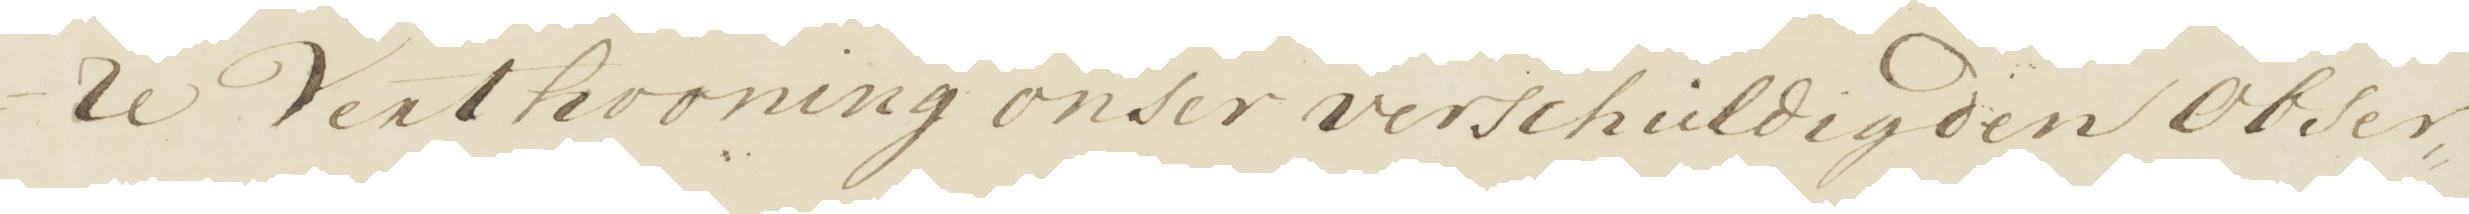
=re Verthooning onser verschuldigden obser„
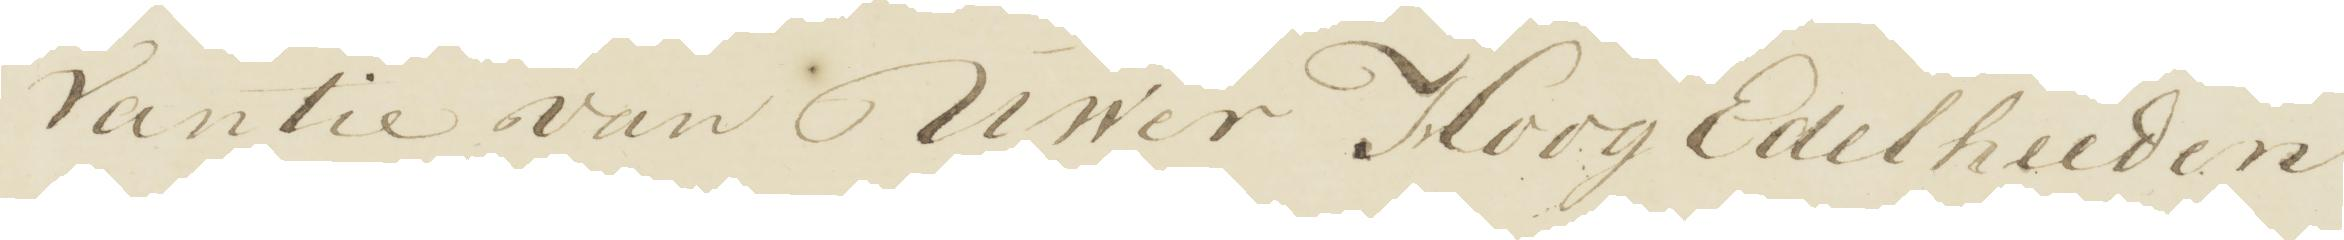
vantie van Uwer Hoog Edelheeden
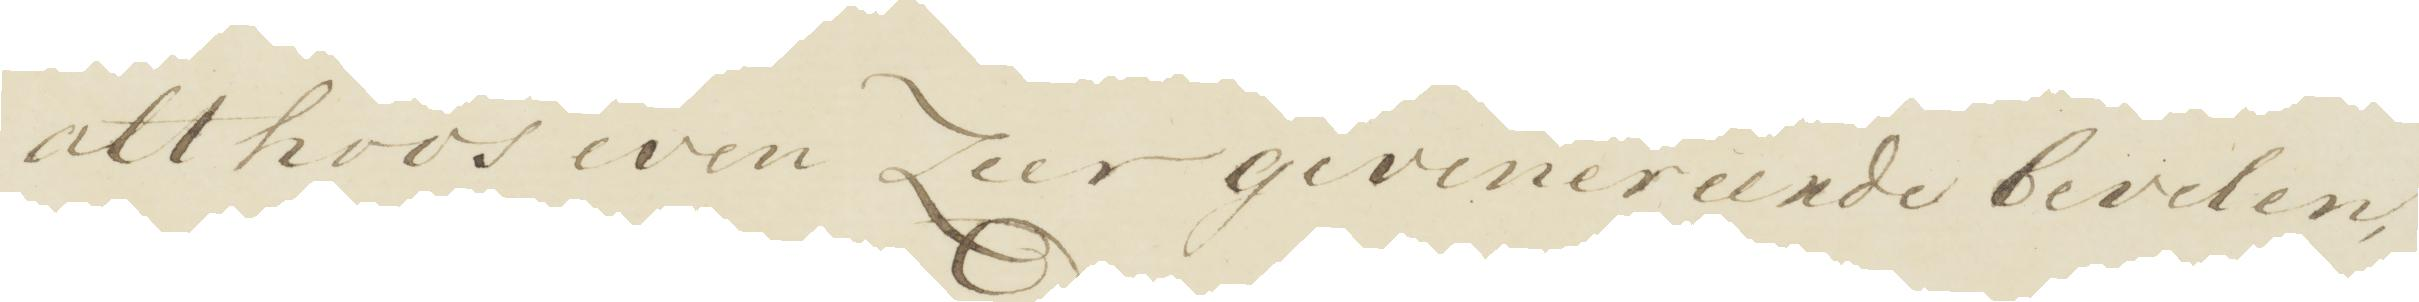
althoos even zeer gevenereerde bevelen,
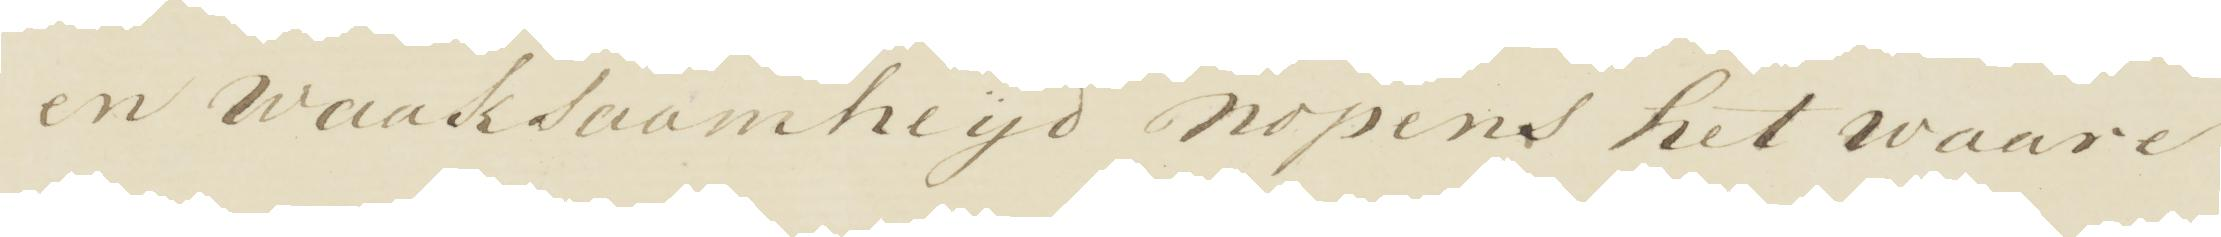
en waaksaamheijd nopens het waare
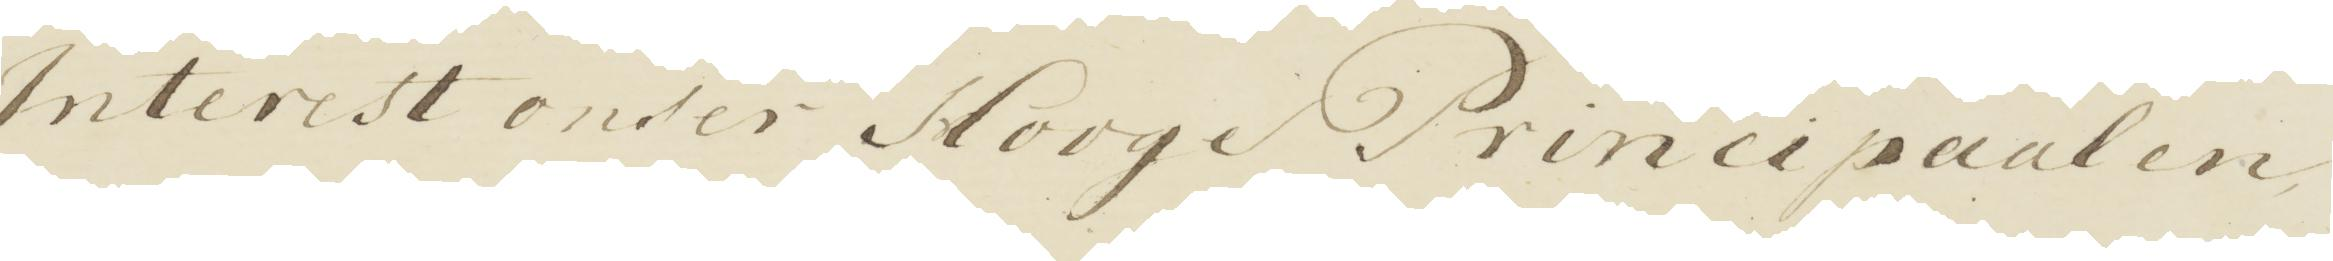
Jnterest onser Hooge Principaalen,
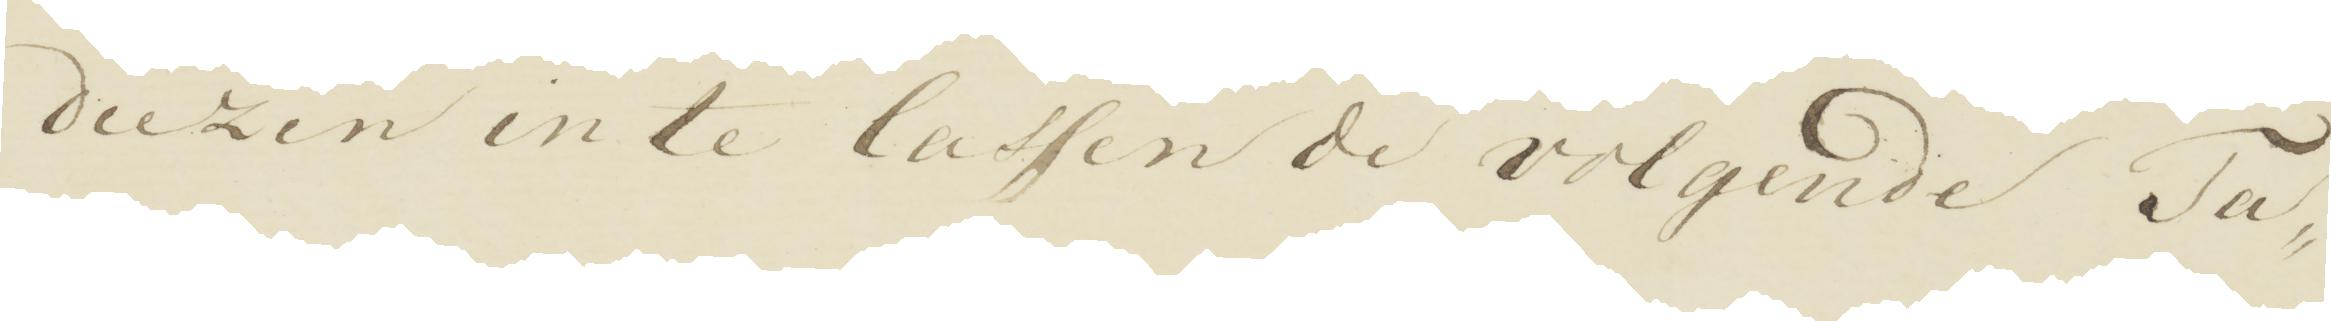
deezen in te lassen de volgende Ta„
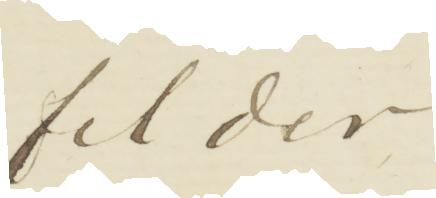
fel der
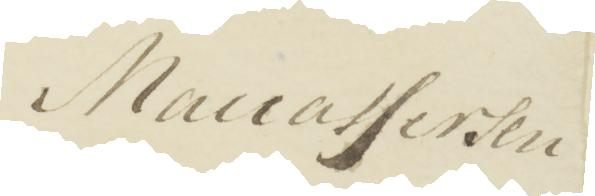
Maccassersen
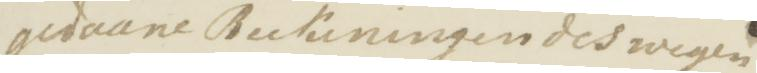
gedaane Reekeningen des wegen
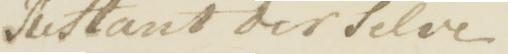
Instant der selve
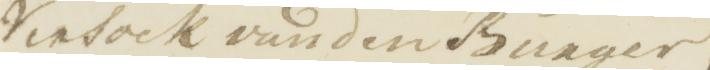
Versoek van den Burger
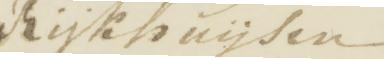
Rijkhuijsen
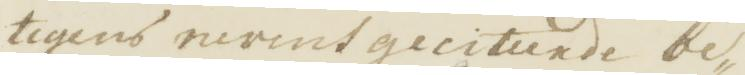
tegens nevens geciteerde be„
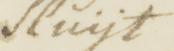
sluijt
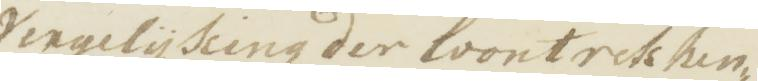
Vergelijking der loon trekken„
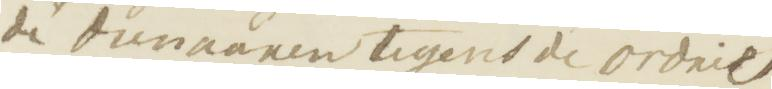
de dienaaren tegens de ordris
